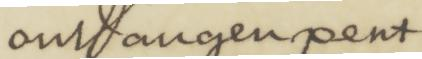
ontfangen pert
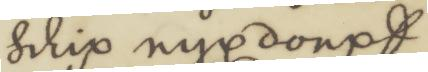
schip ryxdorpf
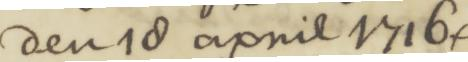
den 18 april 1716
